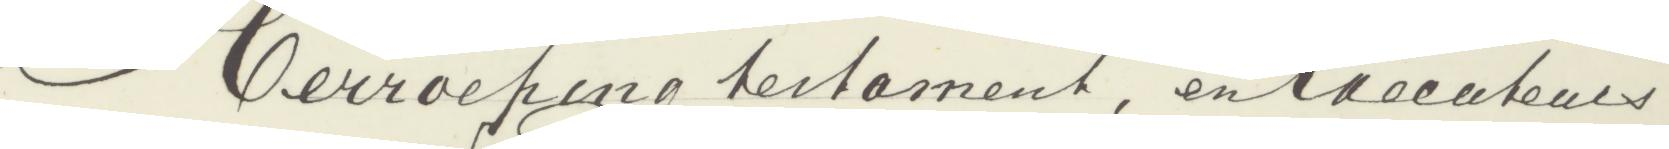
Herroeping testament, en Executeurs
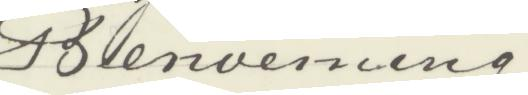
Benoeming
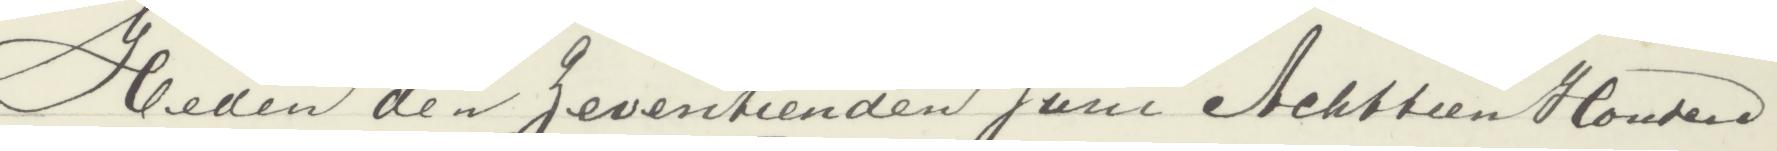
Heden den Zeventienden Juni Achttien Honderd
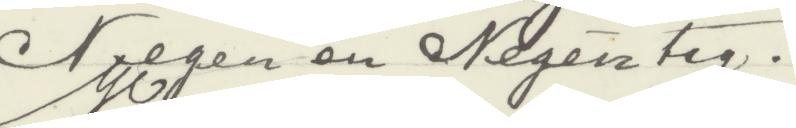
Negen en Negentig.
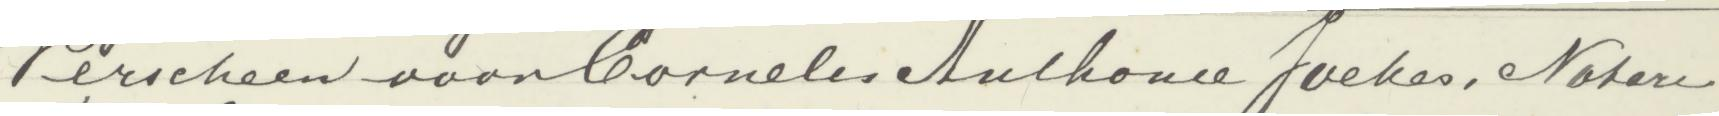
Verscheen voor Cornelis Anthonie Joekes, Notaris
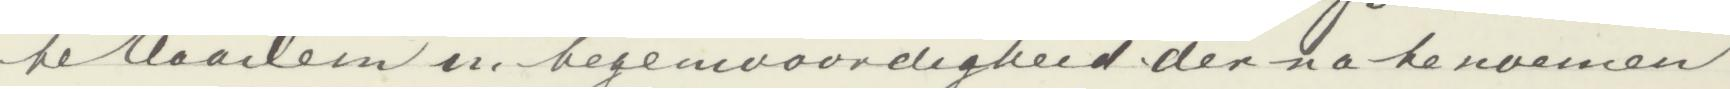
te Haarlem in tegenwoordigheid der na te noemen
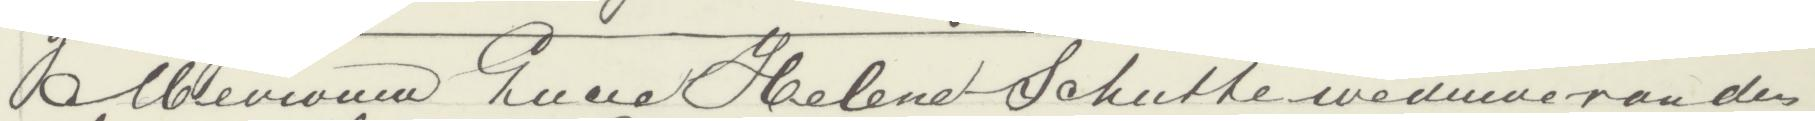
Mevrouw Lucie Helene Schutte weduwe van den
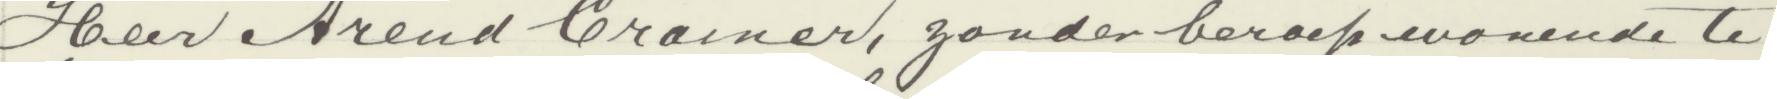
Heer Arend Cramer, zonder beroep wonende te
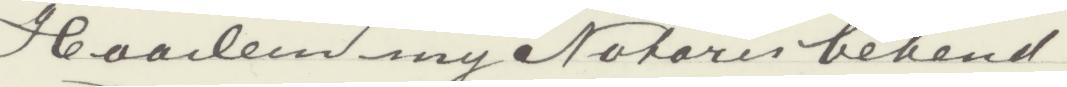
Haarlem my Notaris bekend
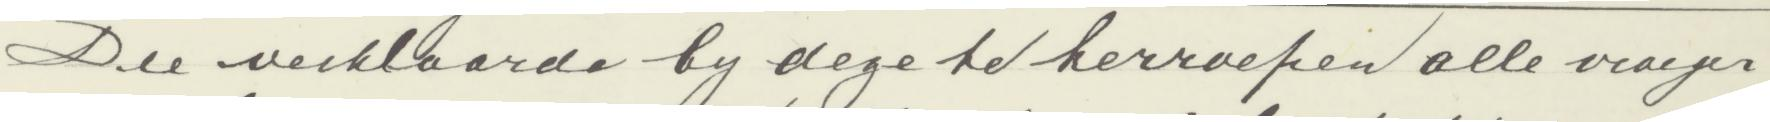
Die verklaarde by deze te herroepen alle vroeger
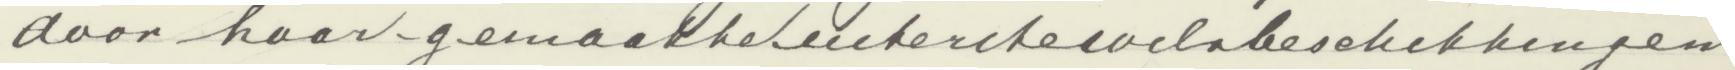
door haar gemaakte uiterste wilsbeschikkingen
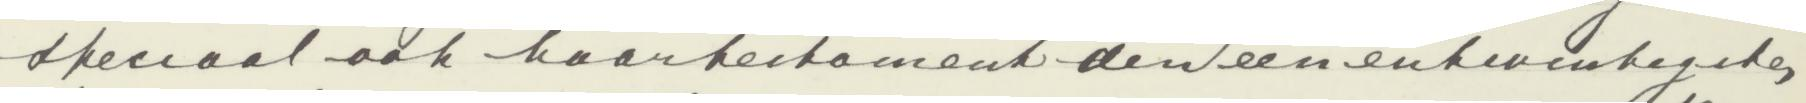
speciaal ook haar testament den een en twintigsten
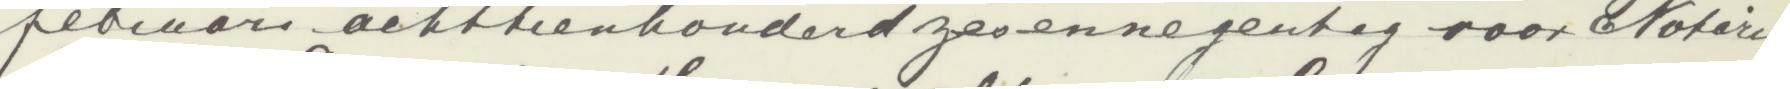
februari achttienhonderd zes ennegentig voor Notaris
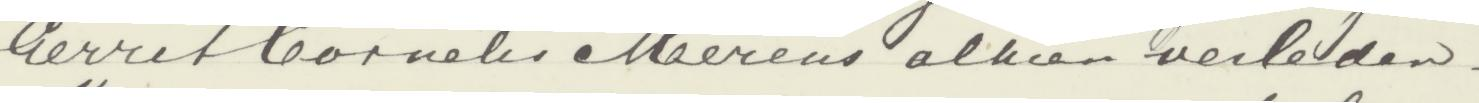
Gerrit Cornelis Meerens alhier verleden
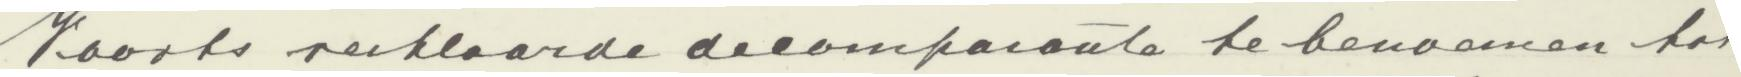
Voorts verklaarde de comparante te benoemen tot
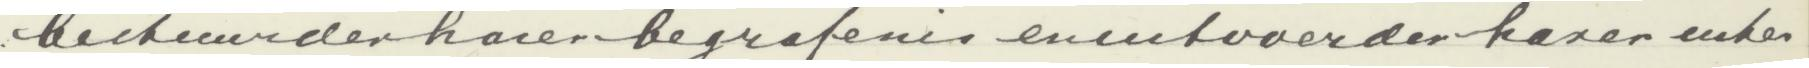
bestuurder harer begrafenis en uitvoerder harer uiter
